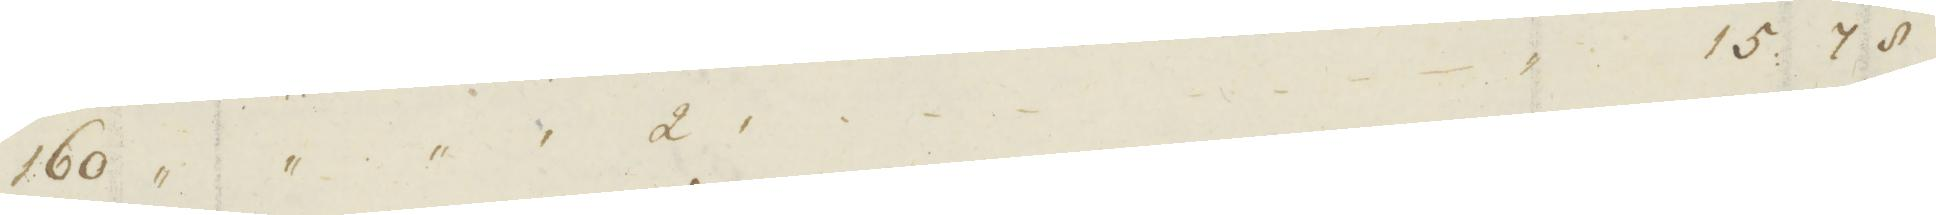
160 „ „ „ „ 2 „ - - - - - - - - „ 15: 7 8
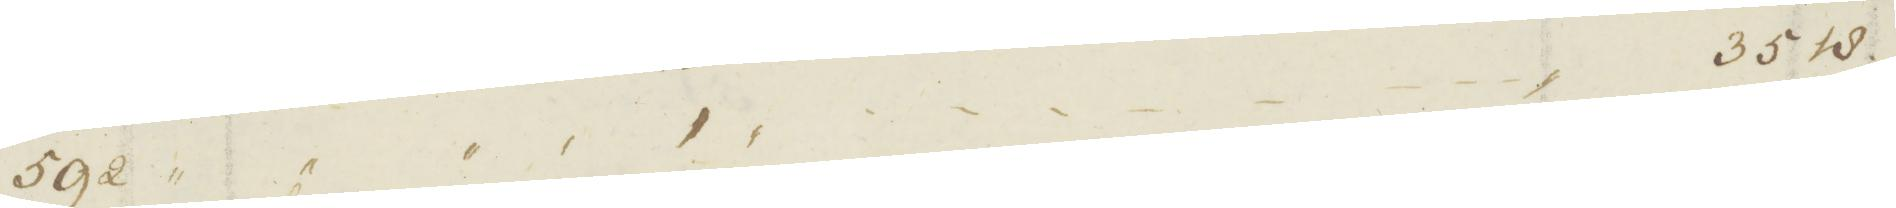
592 „ „ „ „ 1 „ - - - - - - - „ 35 18.
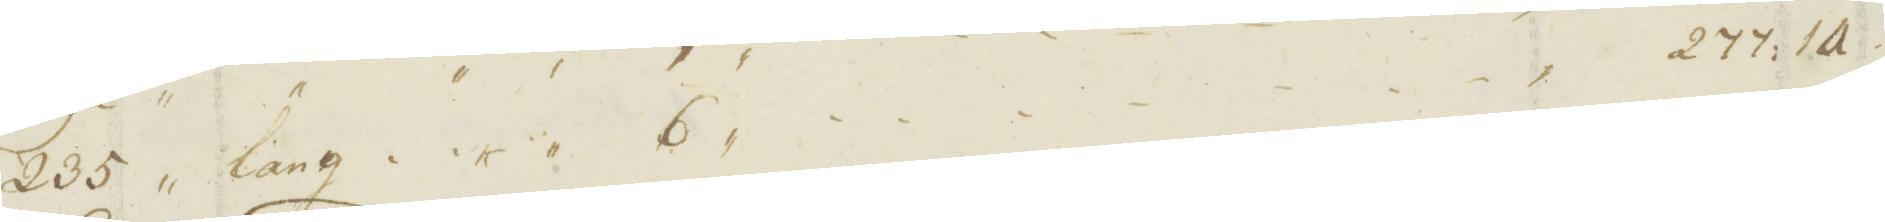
235 „ lang „ „ 6 „ - - - - - - - - „ 277: 14
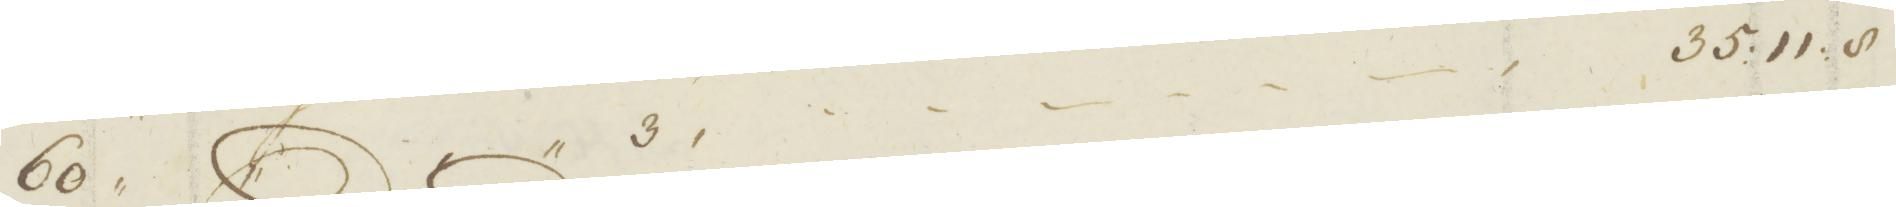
60 „ „ „ „ 3 „ - - - - - - „ 35: 11: 8
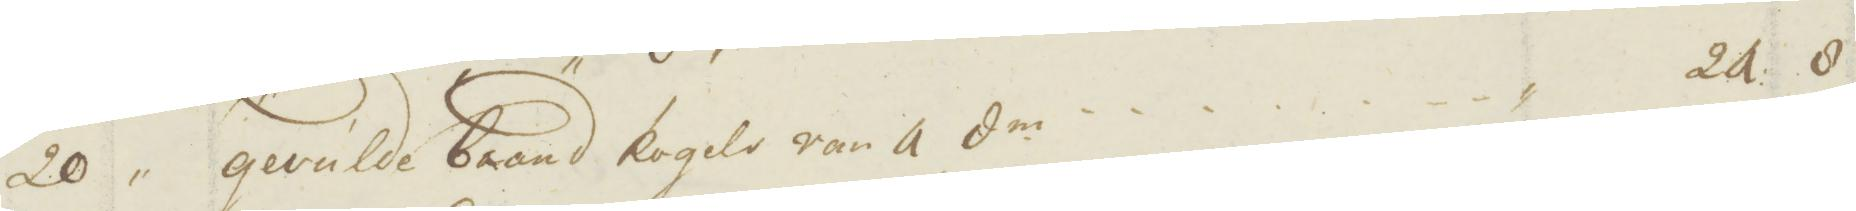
20 „ gevulde brand kogels van 4 dm - - - - - - - „ 24: 8
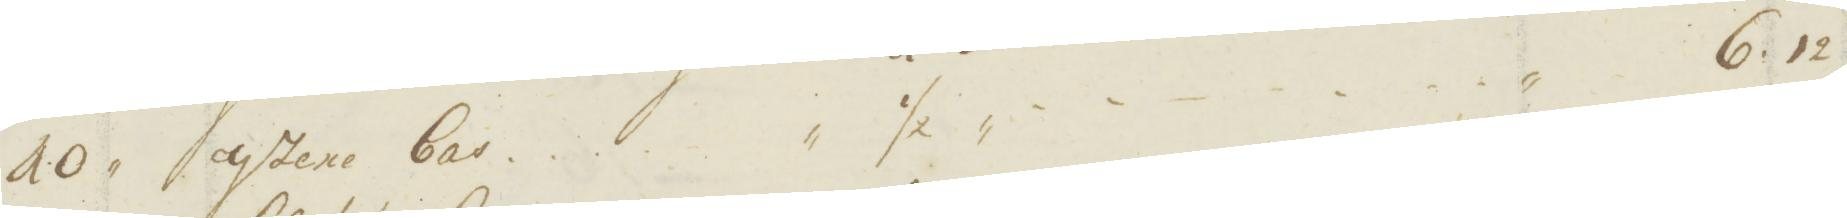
40 „ ijzere bas . . . . „ ½ „ - - - - - - - „ 6: 12
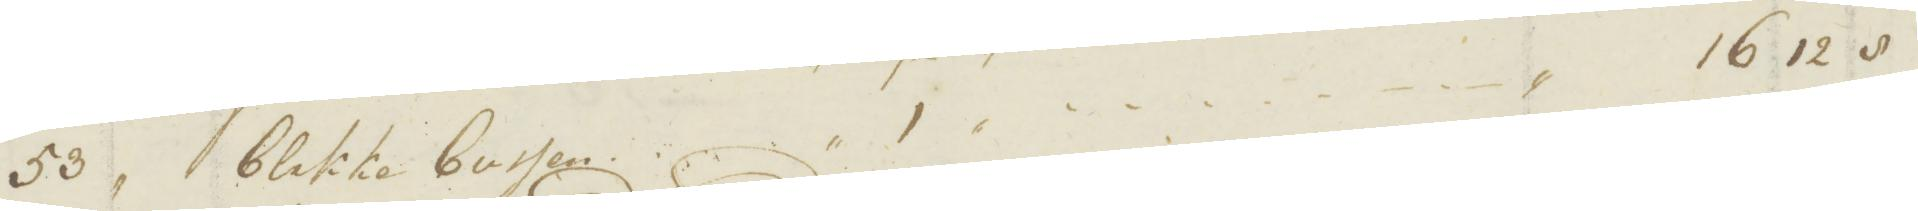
53 „ blikke bussen . . . . „ 1 „ - - - - - - - „ 16: 12 8
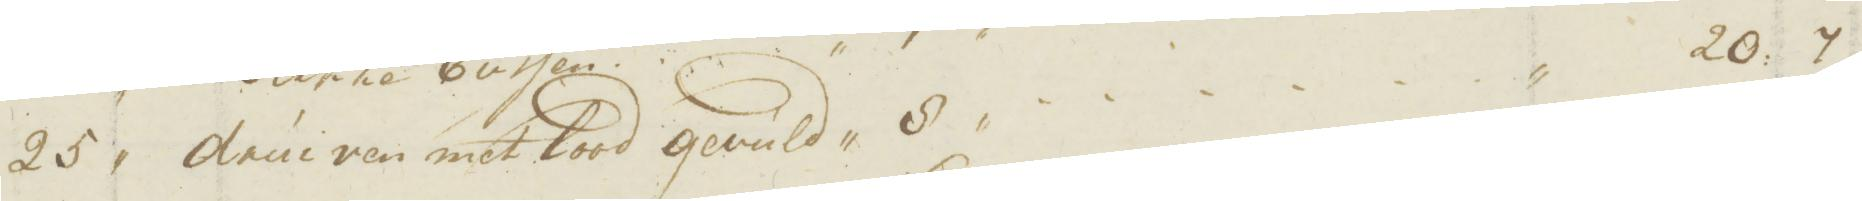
25 „ druiven met lood gevuld „ 8 „ - - - - - - „ 20: 7
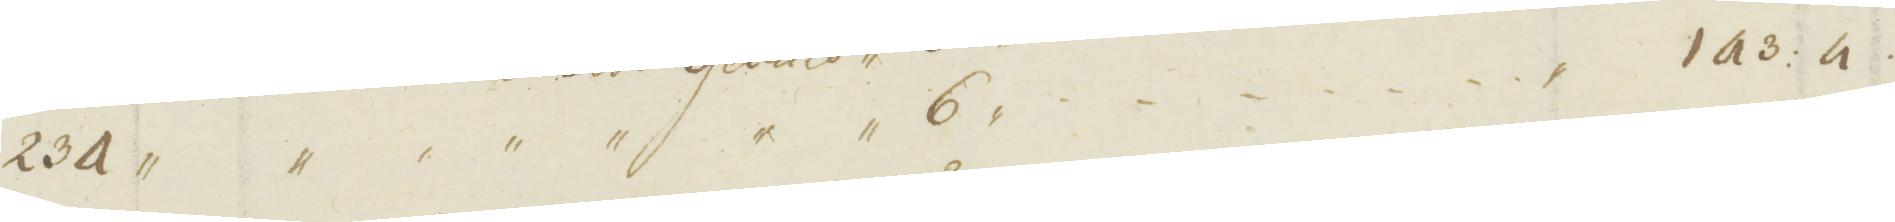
234 „ „ „ „ „ „ „ 6 „ - - - - - - „ 143: 4
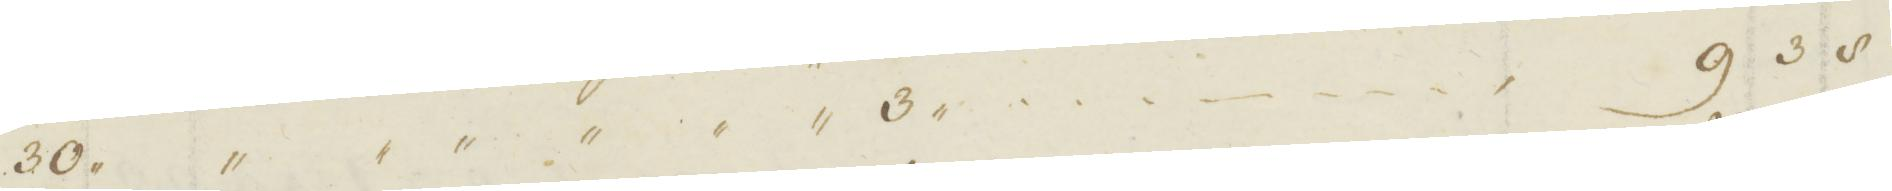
30 „ „ „ „ „ „ „ 3 „ - - - - - - - „ 9 3 8
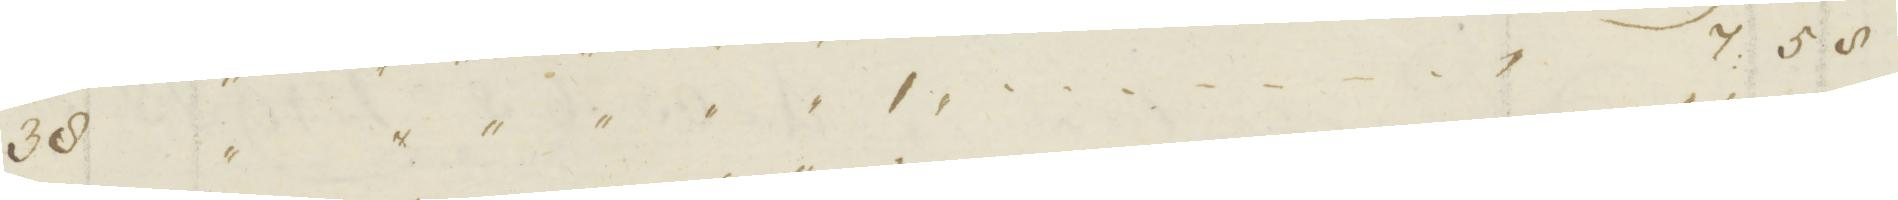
38 „ „ „ „ „ „ 1 „ - - - - - - - - „ 7: 5 8
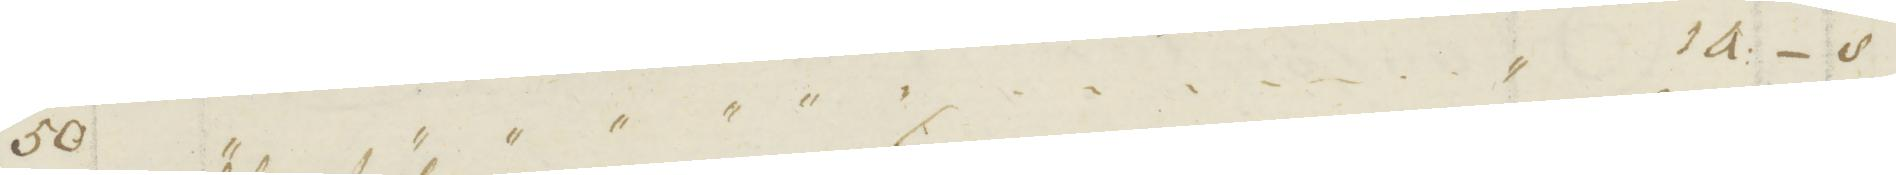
50 „ „ „ „ „ „ „ - - - - - - - „ 14: — 8
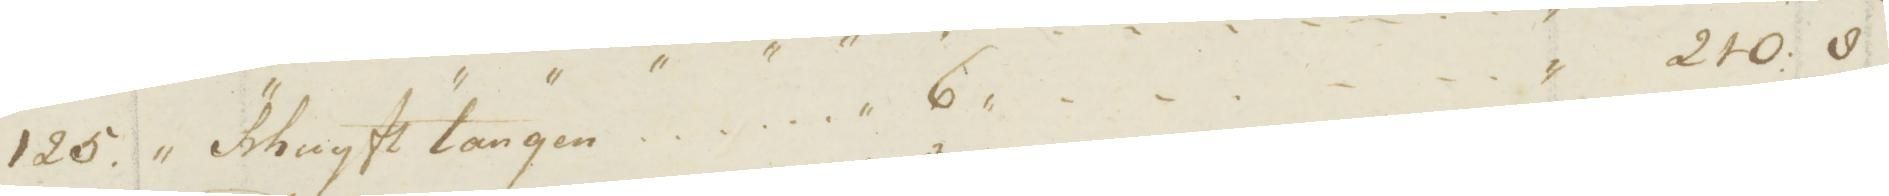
125 „ schuijft tangen . . . . . . „ 6 „ - - - - - - „ 210: 8
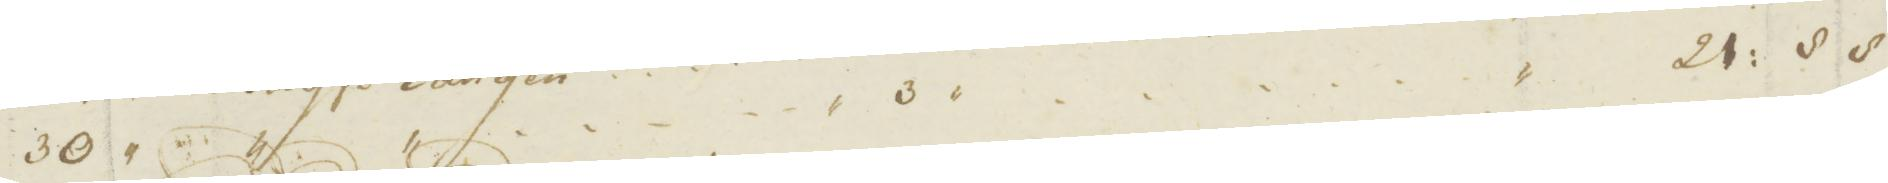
30 „ „ „ - - - - - „ 3 „ - - - - - - „ 21: 8 8
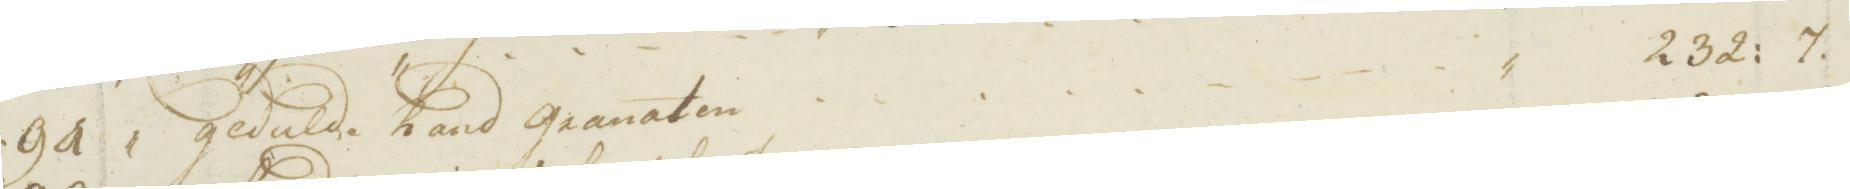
94 „ gevulde hand granaten - - - - - - - - - „ 232: 7.
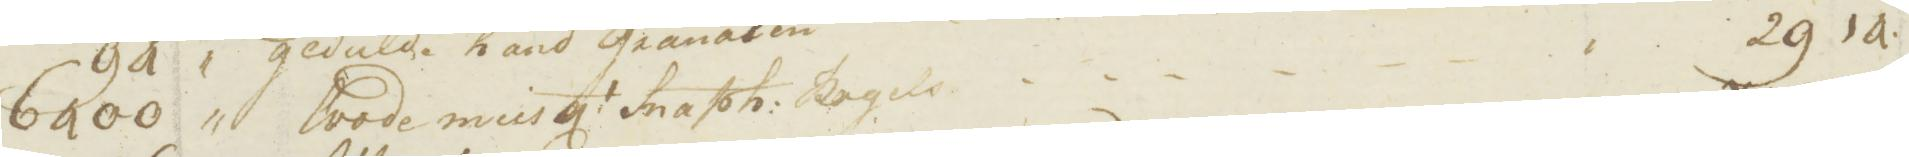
6400 „ loode musq:t snaph: kogels - - - - - - „ 29 14.
